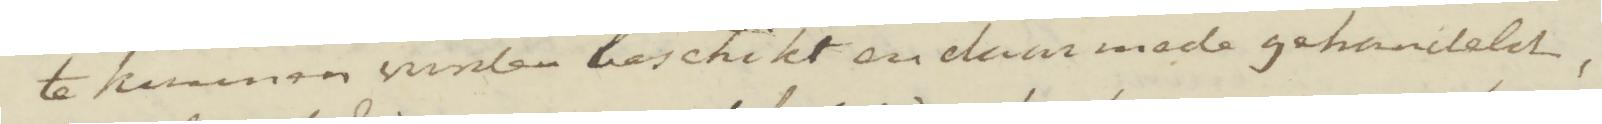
te kunnen worden beschikt en daar mede gehandeld
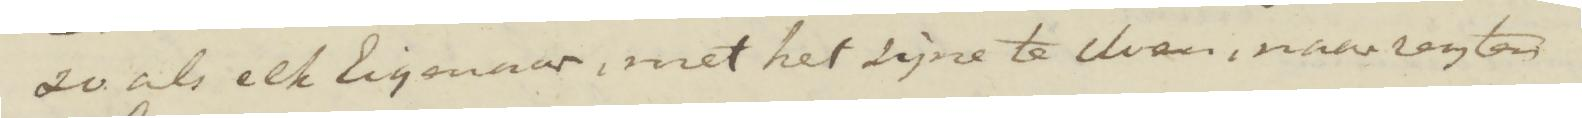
zo als elk Eigenaar, met het zijne te doen, naar regten
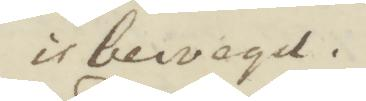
is bevoegd.
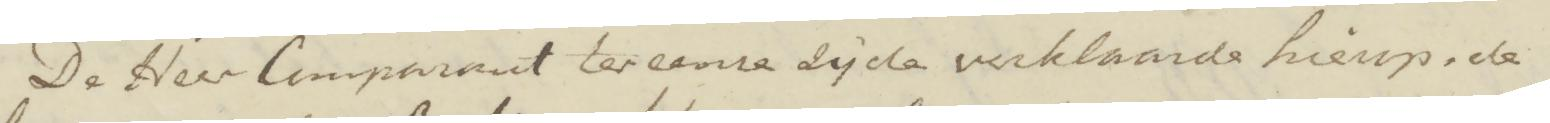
De Heer Comparant ter eerne zijde verklaarde hierop, de
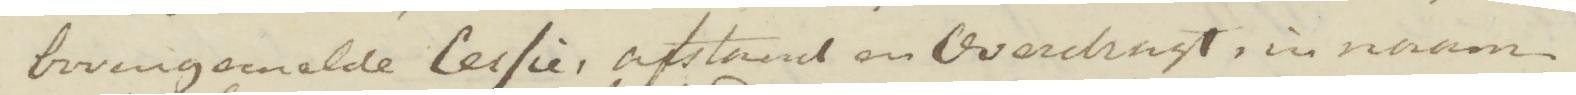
bovengemelde Cessie, afstand en Overdragt, in naam
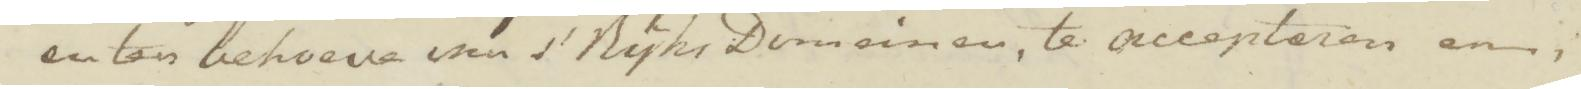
en ten behoeve van s' Rijks Domeinen, te accepteren en;
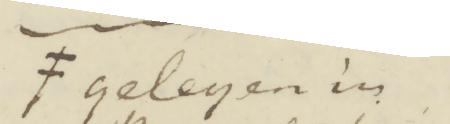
¶ gelegen in
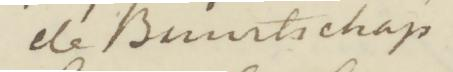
de Buurtschap
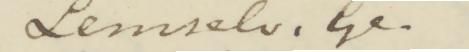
Lemselo, Ge.
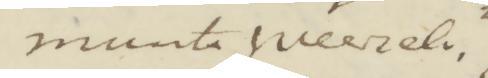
meente weerselo,
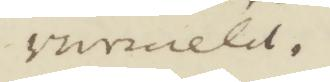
voormeld.
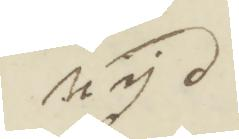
nijd
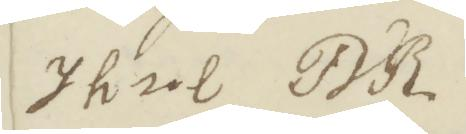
yhvl JVR
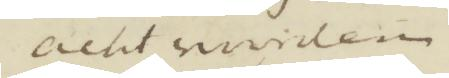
acht woorden
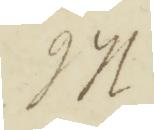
JH
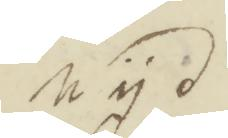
n ij d
